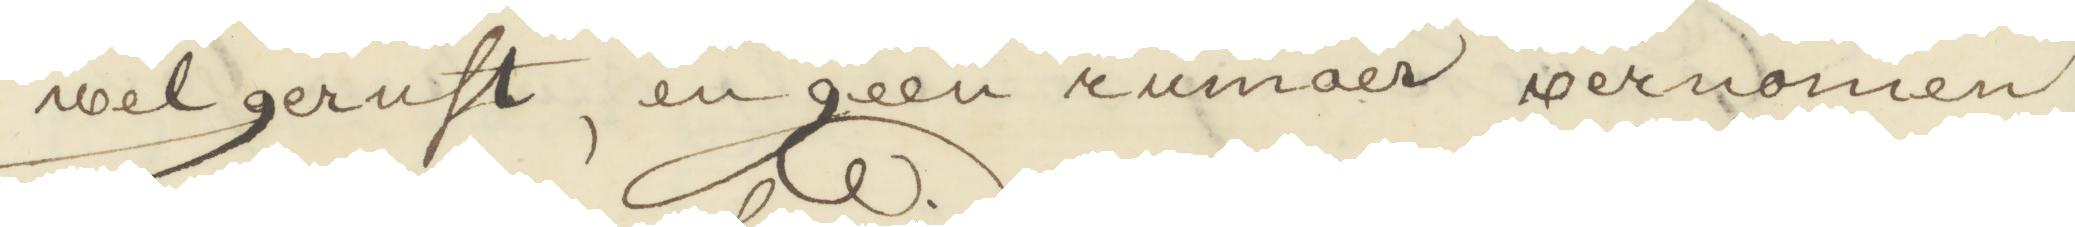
wel gerust, en geen rumoer vernomen
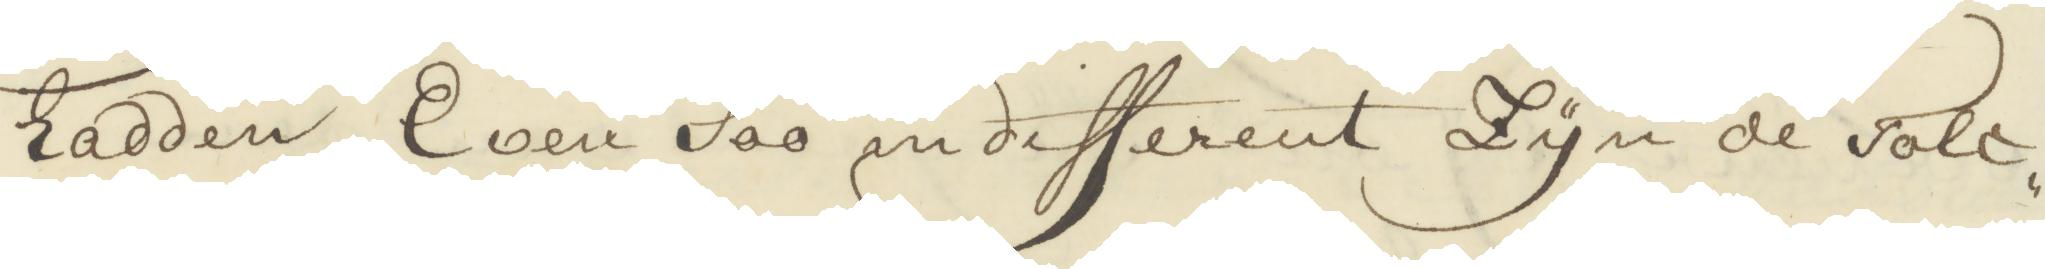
hadden, Even soo in different zijn de Tolc„
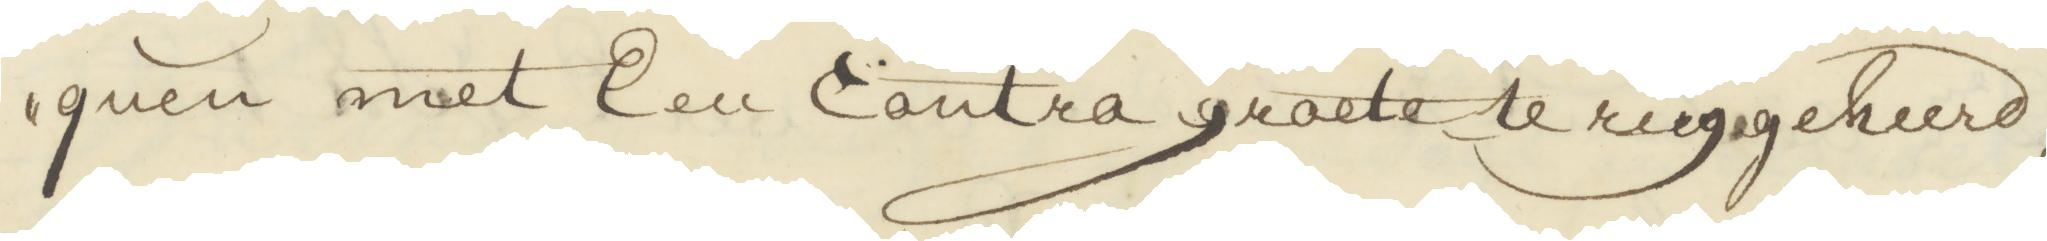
„quen met Een Contra groete te rug gekeerd,
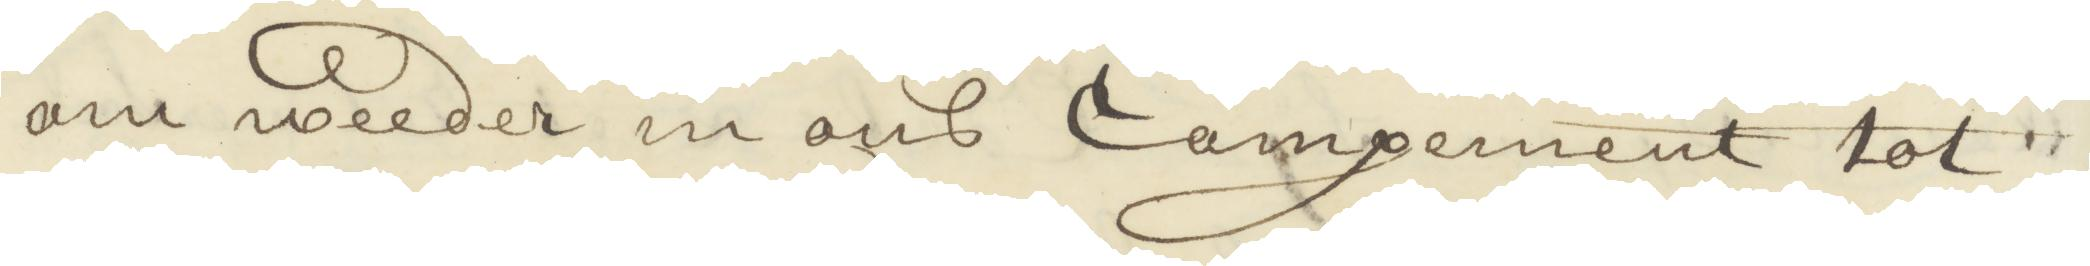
om weeder in ons Campement tot
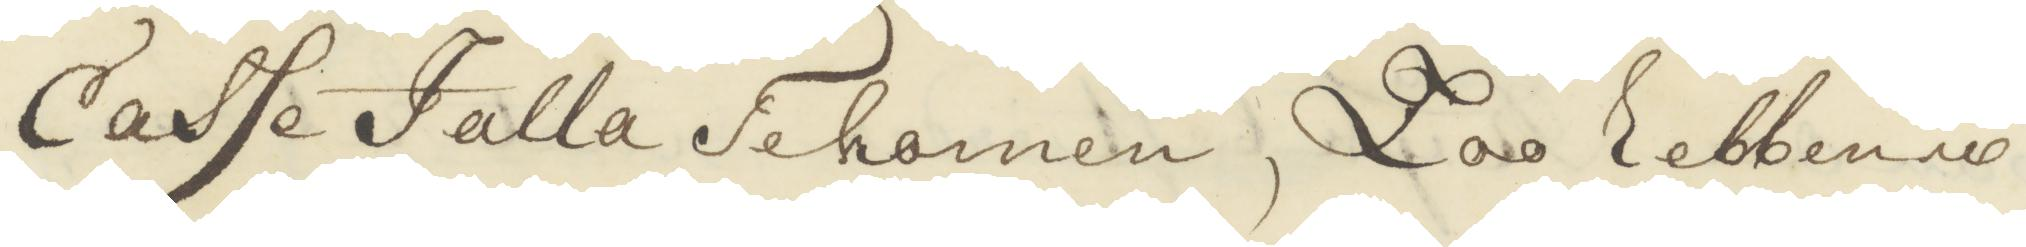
Casse Jalla Te komen, Zoo hebben w'
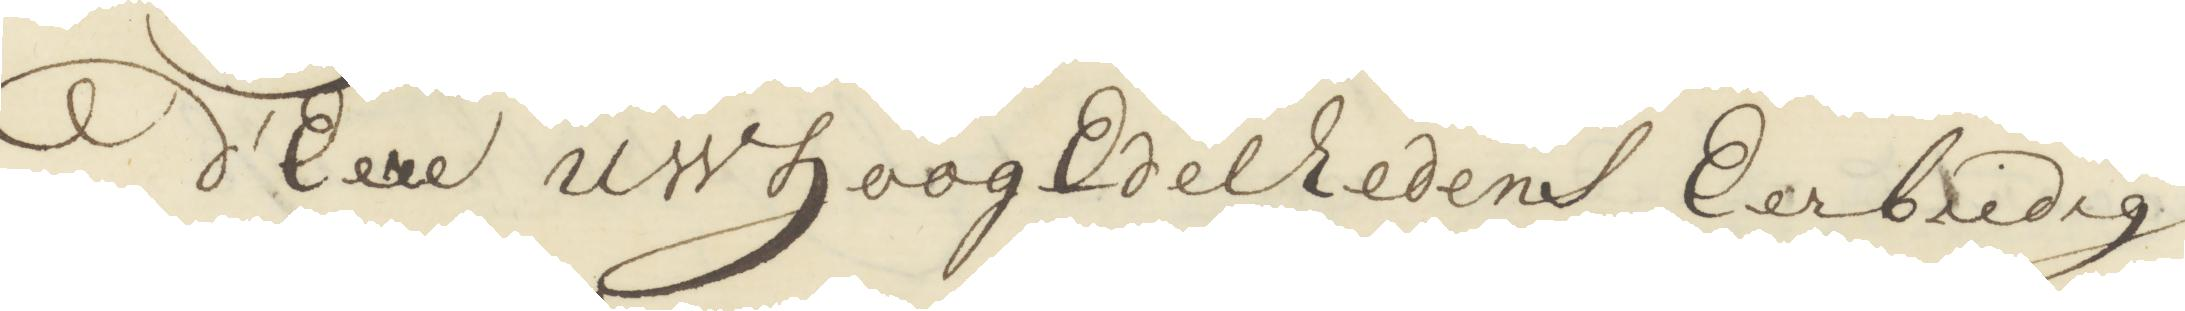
d’Eere uw hoog Edelhedens Eerbiedig
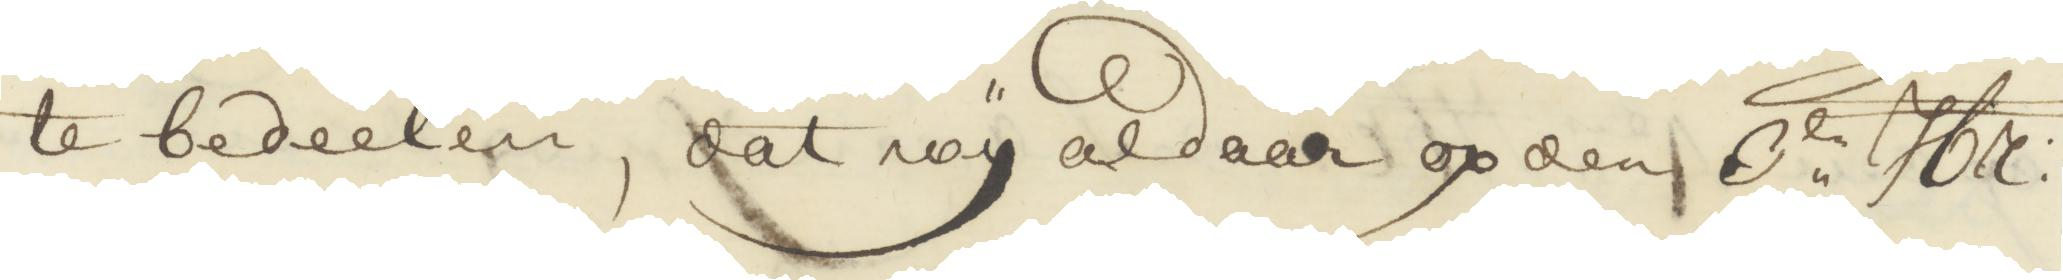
te bedeelen, dat wij aldaar op den 3„en 7br:
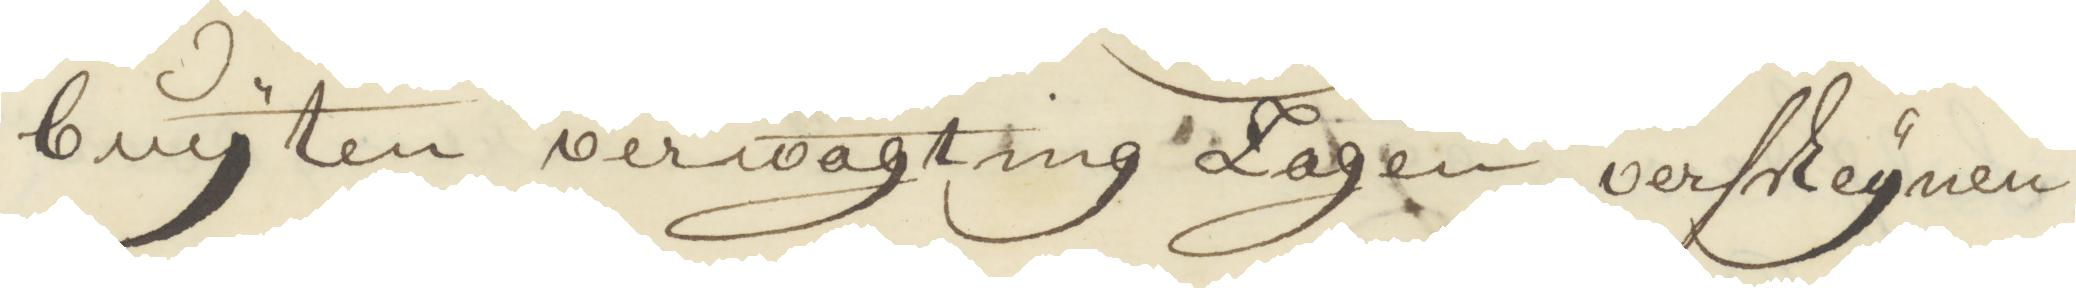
buijten verwagting zagen, verscheijnen
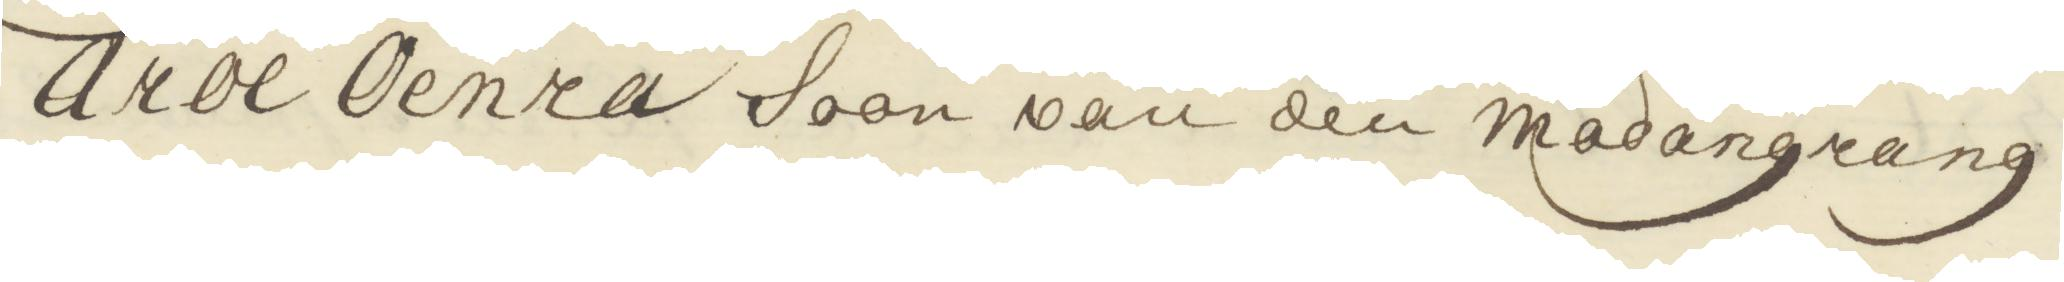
Aroe Oenra soon van den madangrang
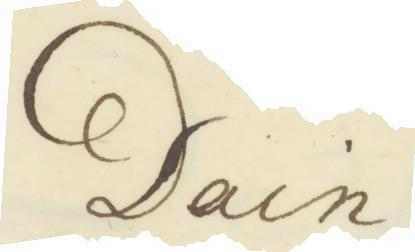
Dain
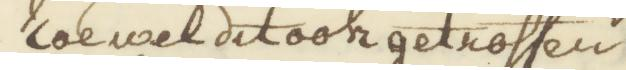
hoe wel dit ook getroffen
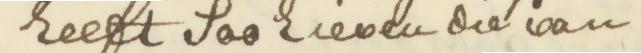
heeft soo hieven die van
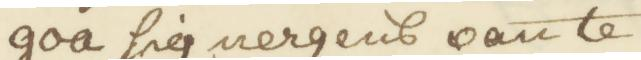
goa sig nergens van te
